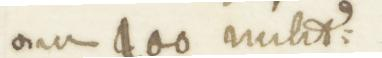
om 400 milit=
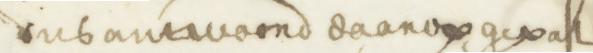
ons antwoord daarop gepast
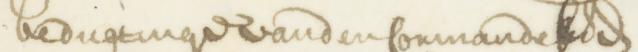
bedugtinge vanden Cormandelsche
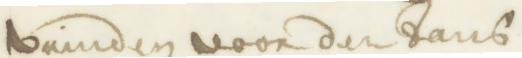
vrinden voor den tans
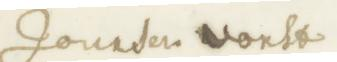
Zoursen vorst
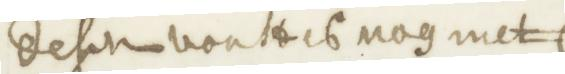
desen vorst is nog met
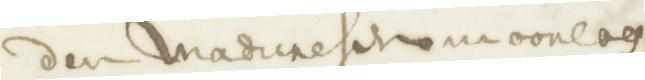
den madurese in oorlog
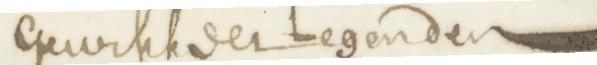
gewikkelt tegenden
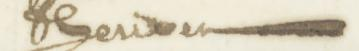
theuver
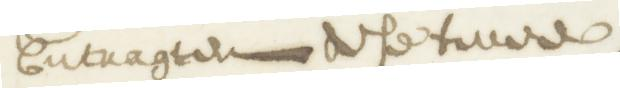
Entragten dese twee
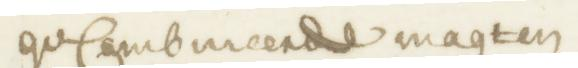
gecombineerde magten
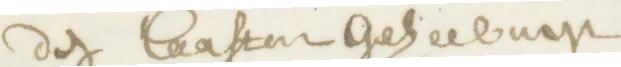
des laasten geheel uyt
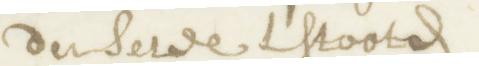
den setel t'stooten
